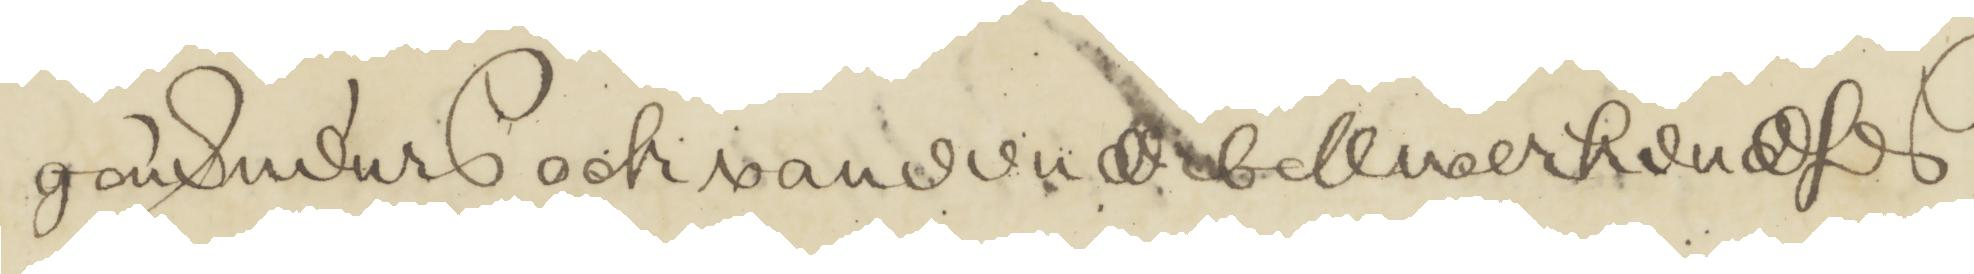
gouverneurs ook van een de bollwerken deses
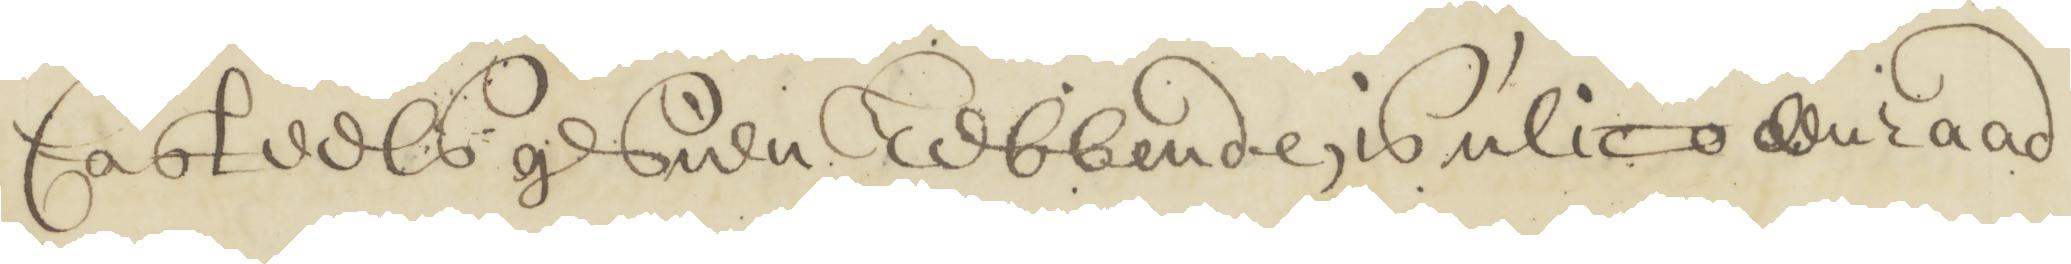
Casteels gesien hebbende, is ulico den raad
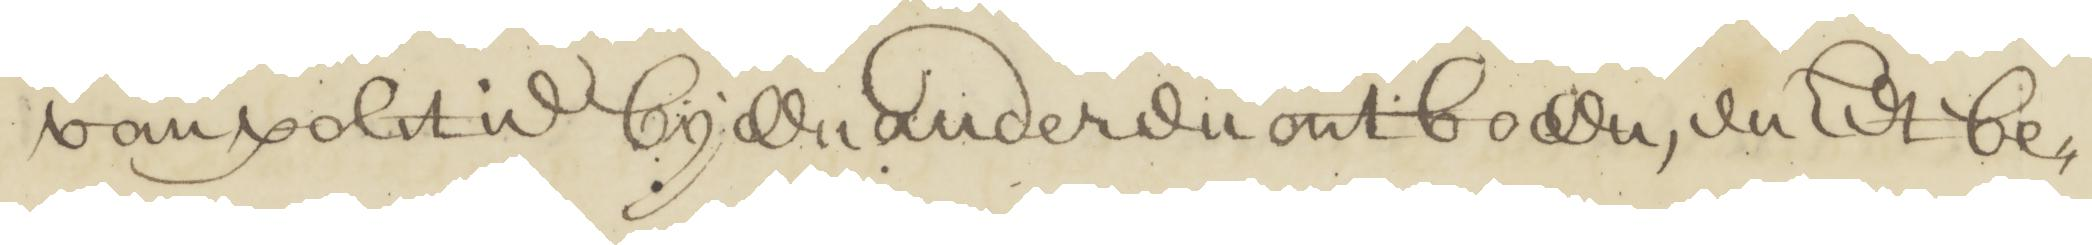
van politie bij den anderen ontboden, en het be„
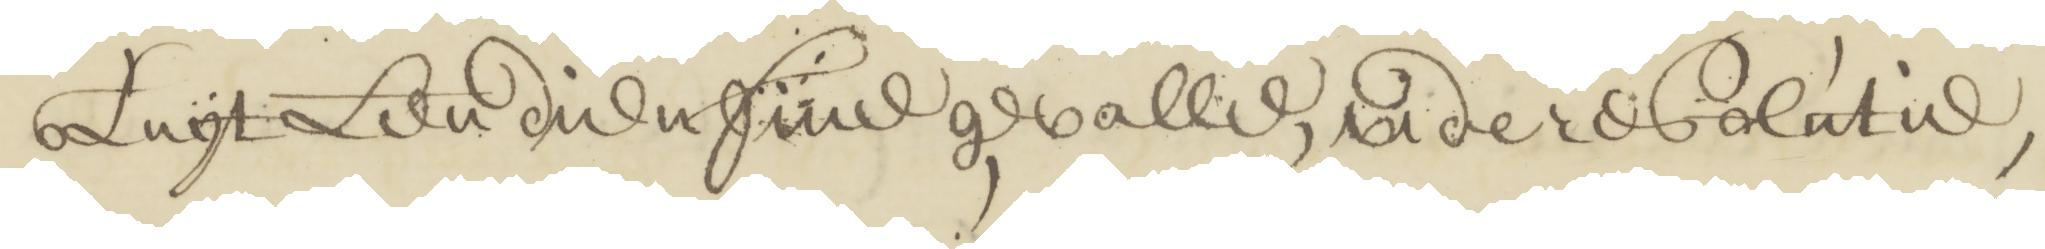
sluijt ten dien fine gevalle, vide resolutie,
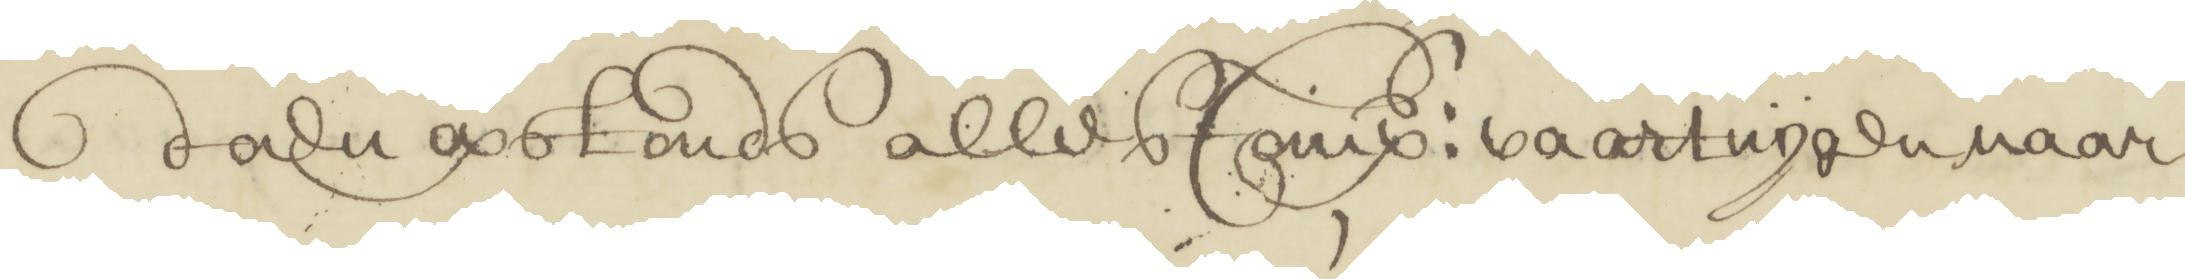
doen opstonds alle 's Comp:s vaartuijgen naar
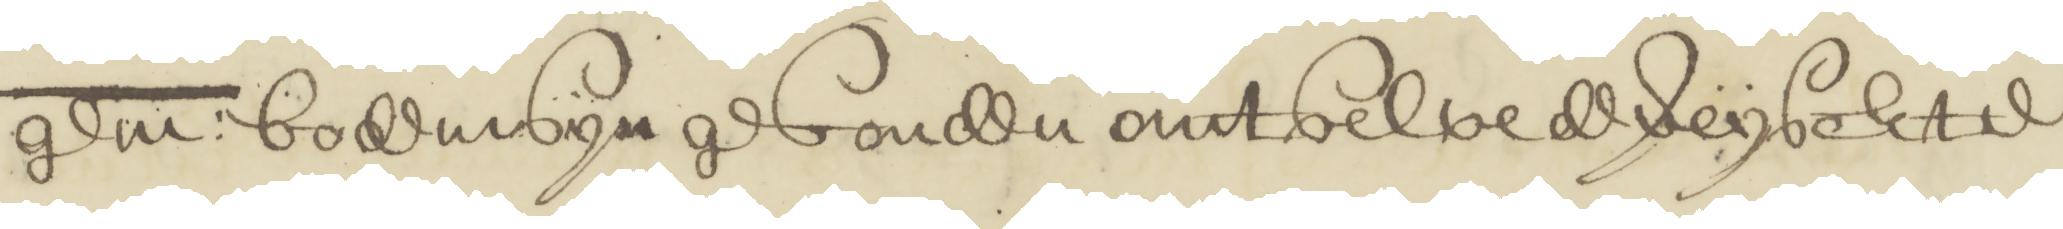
gem: bodem sijn gesonden om't selve de vereijschte
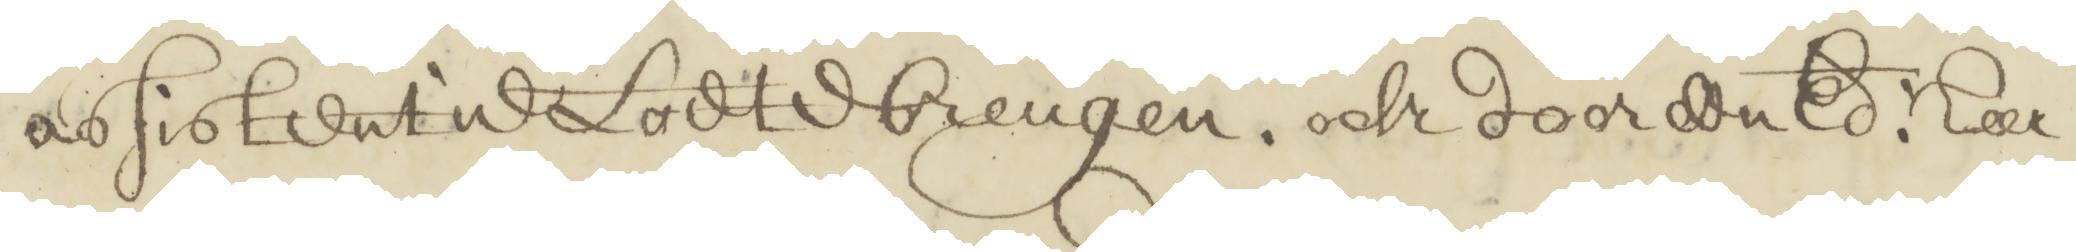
assistentie toe te brengen. ook door den Ed: heer
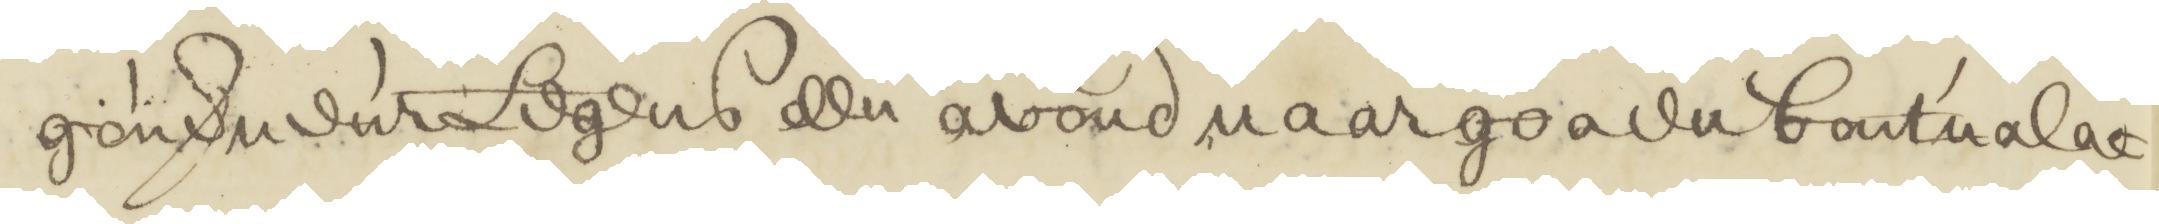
gouverneur tegens den avond naar goa en bontualac
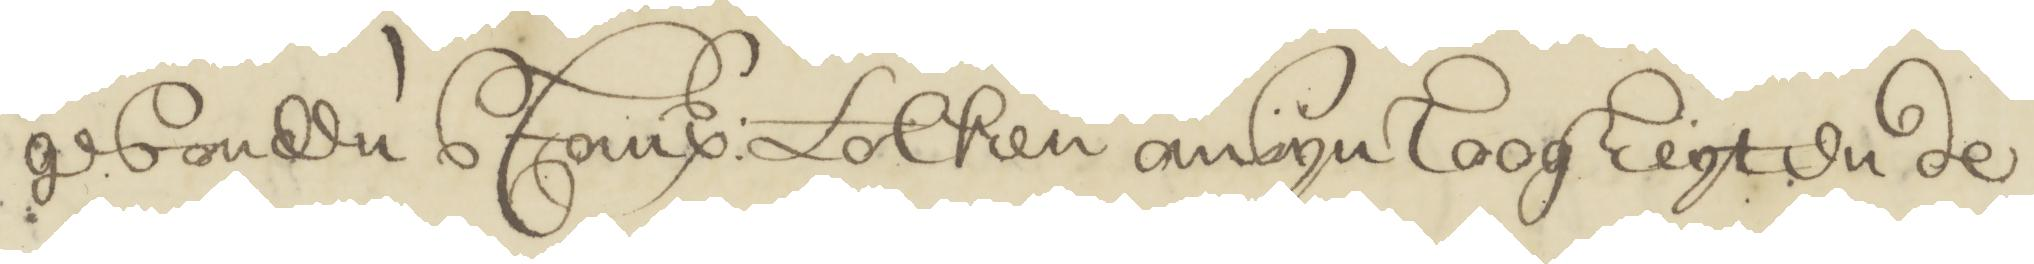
gesonden 'sComp:s tolken omsijn hoogheijt en de
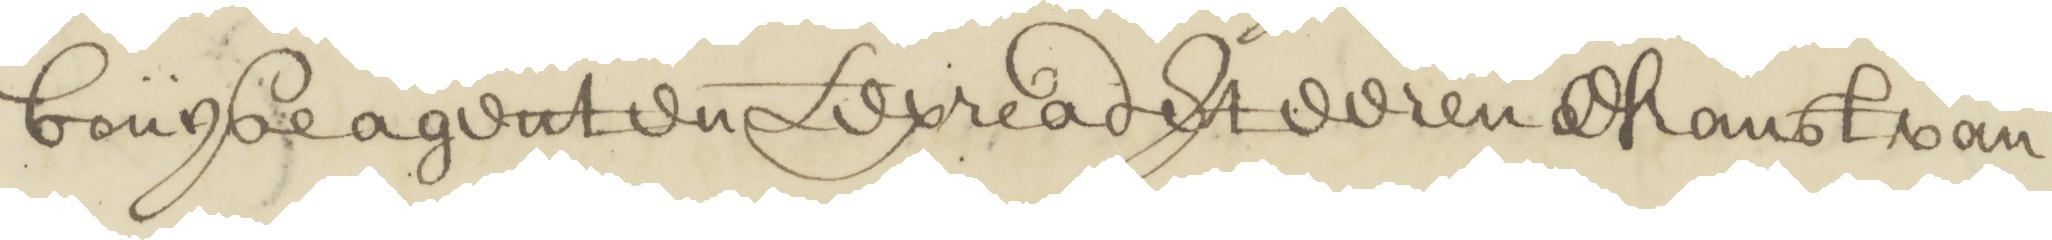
bonijse agenten te preadverteeren de komst van
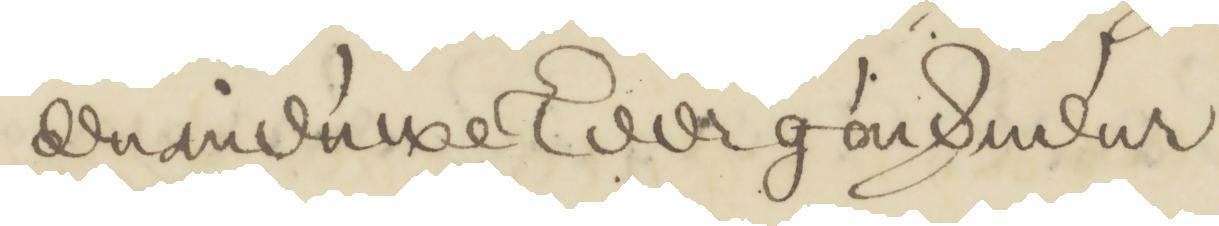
den nieuwe heer gouverneur
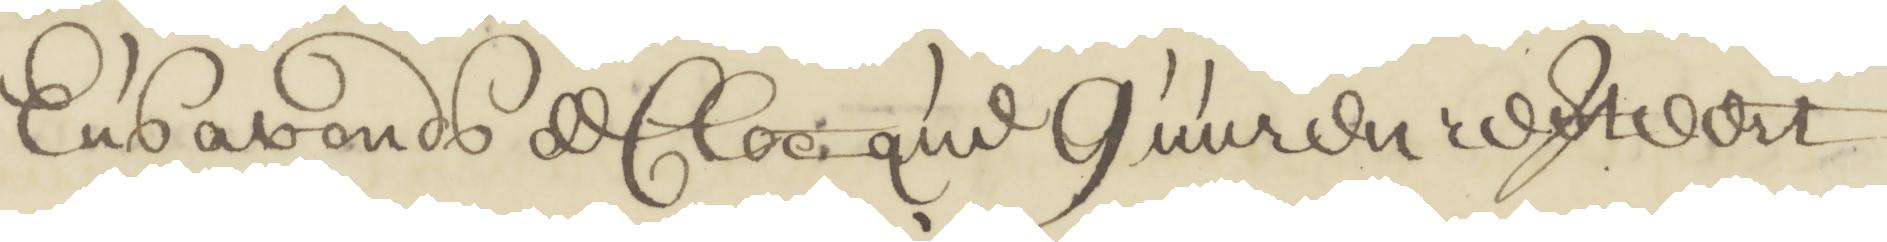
En's avonds de Clocque 9 uuren reverteert
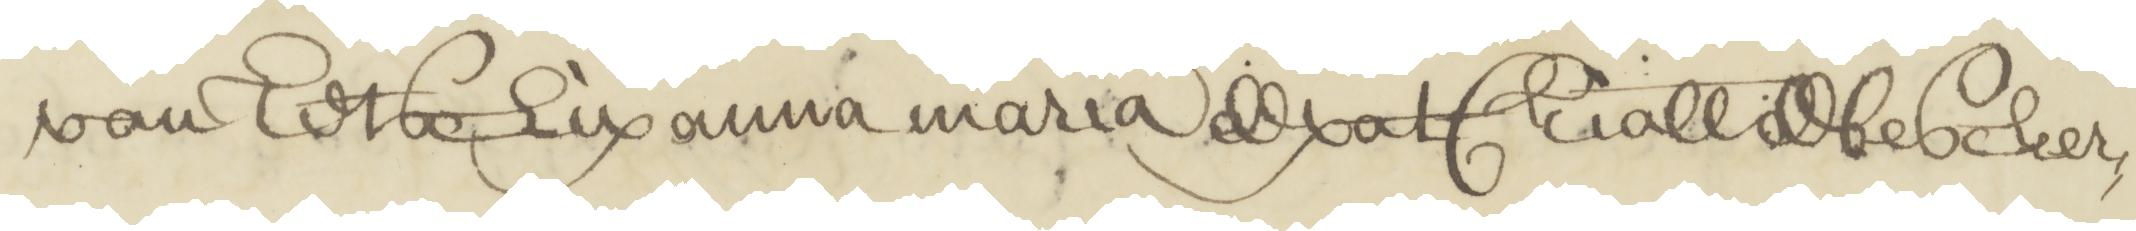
van het schip anna maria depatChiall de bescher„
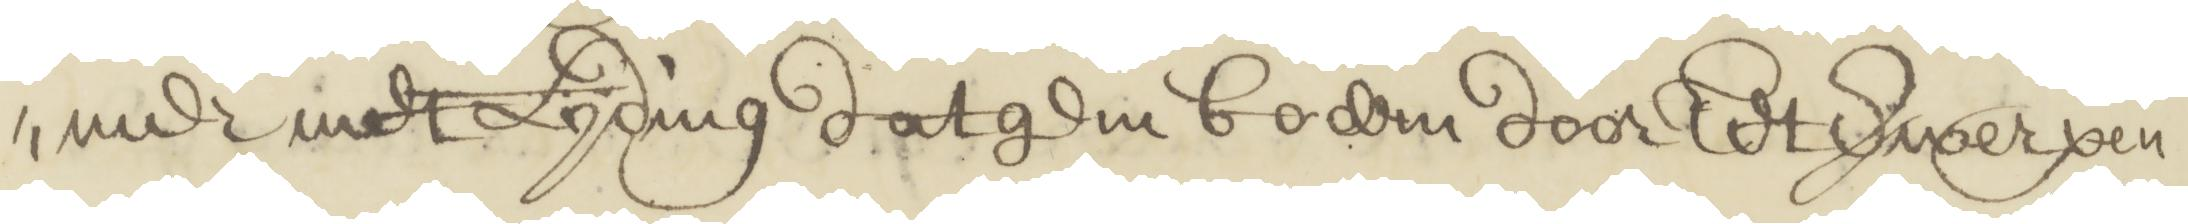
„mer met tijding dat gem bodem door het verwerpen
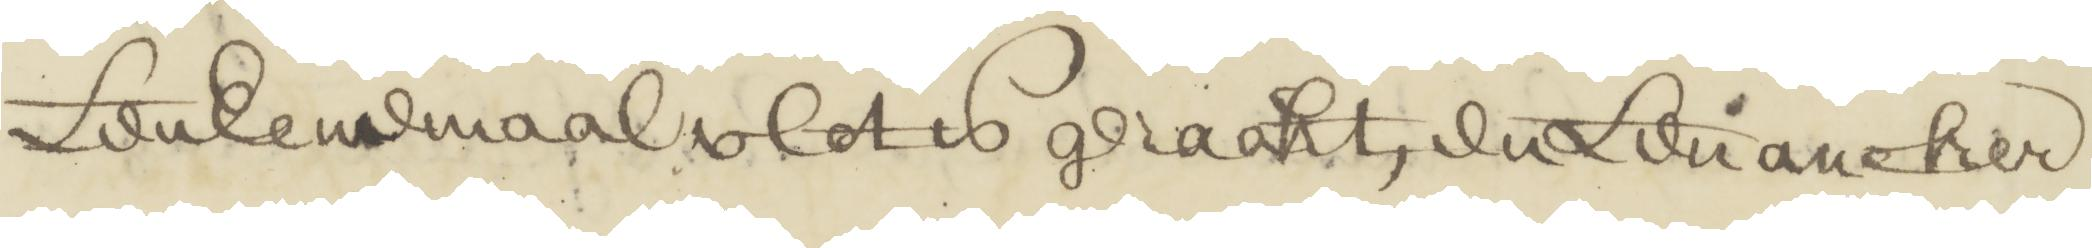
ten Eenemaal vlot is geraakt, en ten ancker
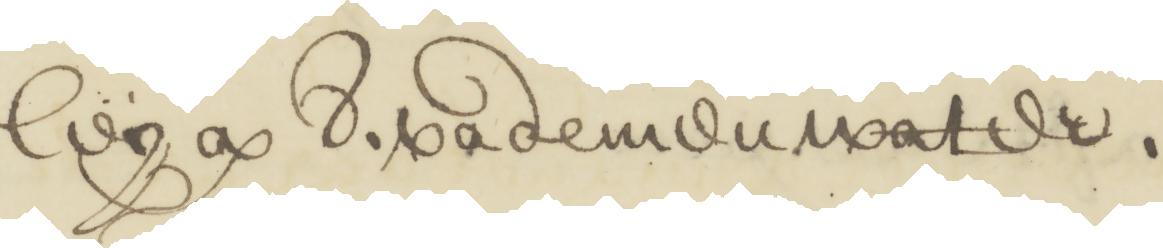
leij op 8. vademen water.
